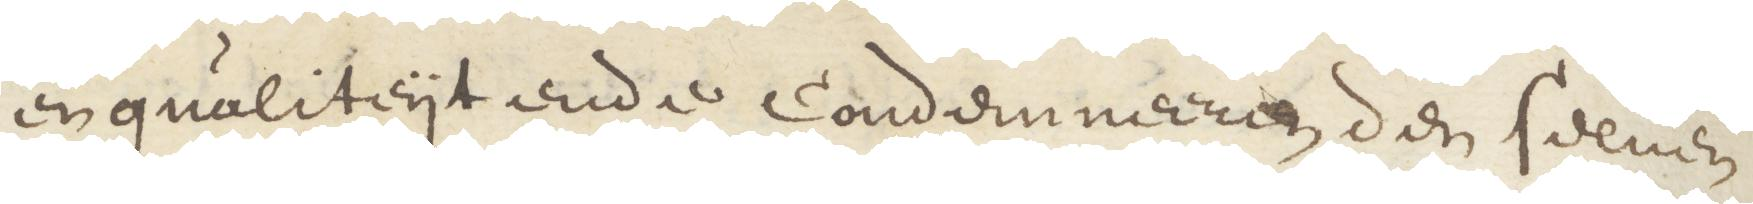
en qualiteijt ende condemneeren den selven
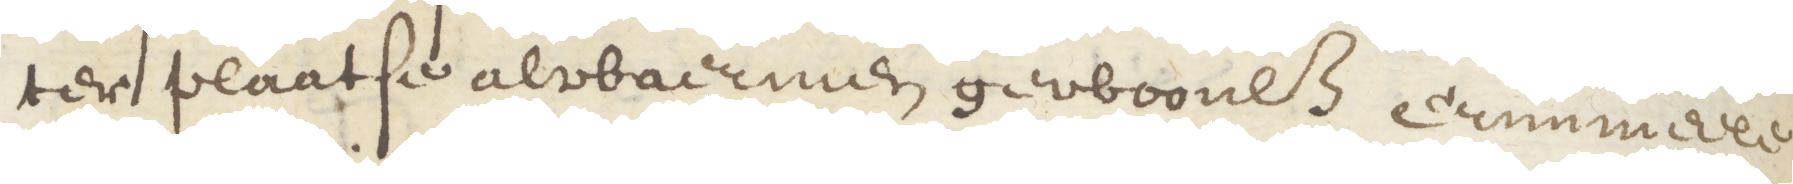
ter plaatse alwaer men gewoonlijk crimineele
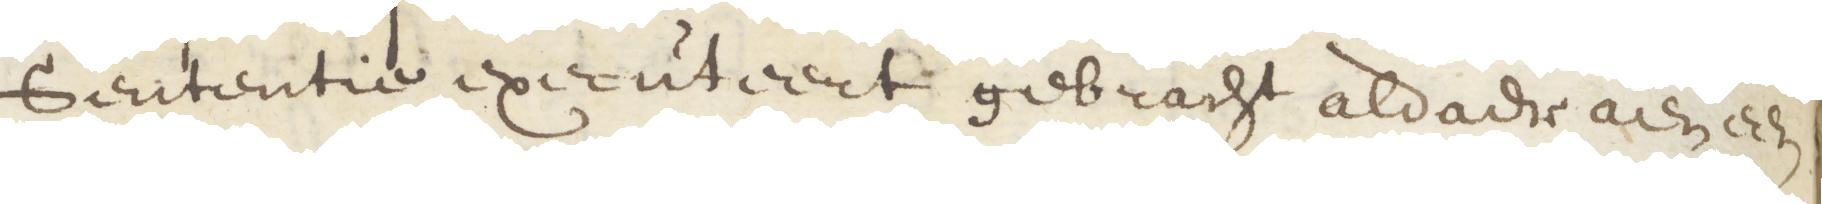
sententie executeert gebracht aldaer aen een
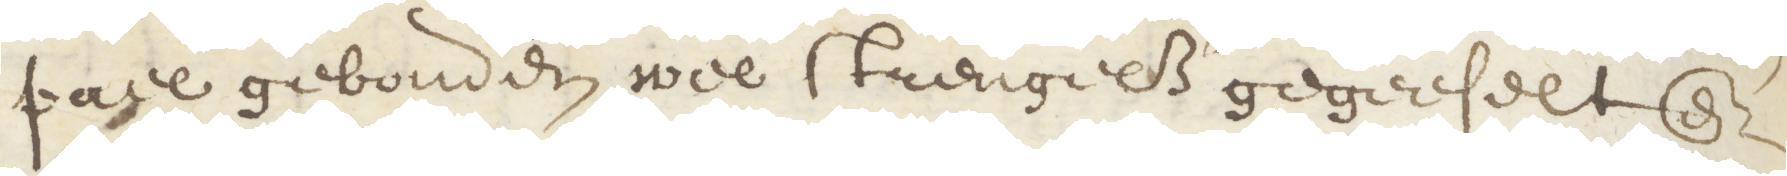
pael gebonden wel strengelijk gegeeselt ende
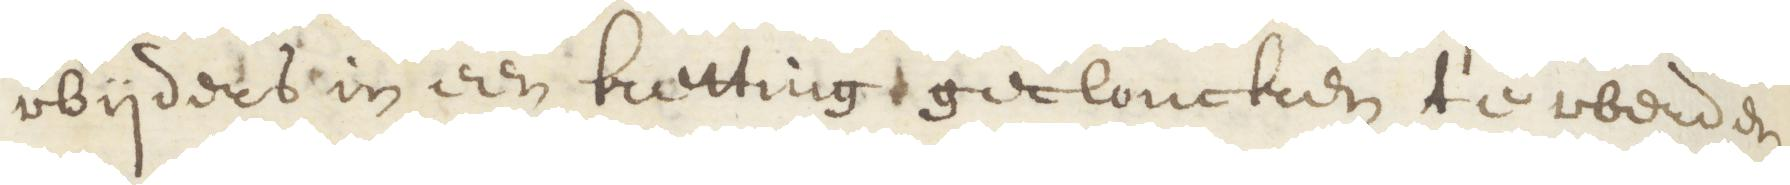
wijders in een ketting gecloncken te werden
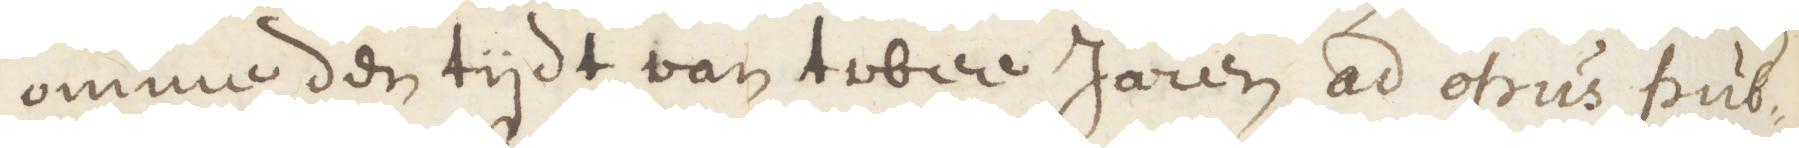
omme den tijdt van twee Jaren ad opus pub„
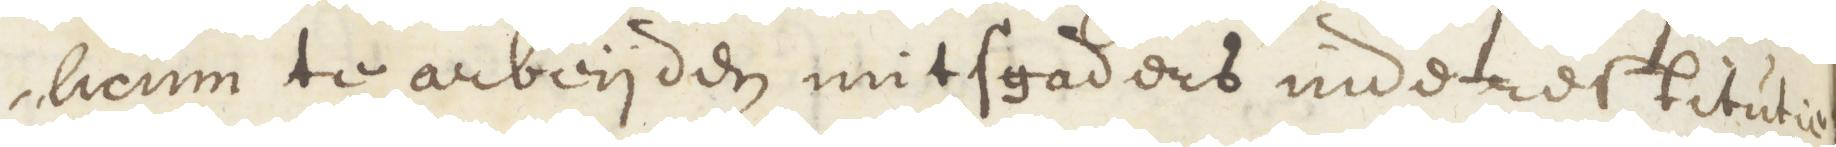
„licum te arbeijden mitsgaders in de restitutie
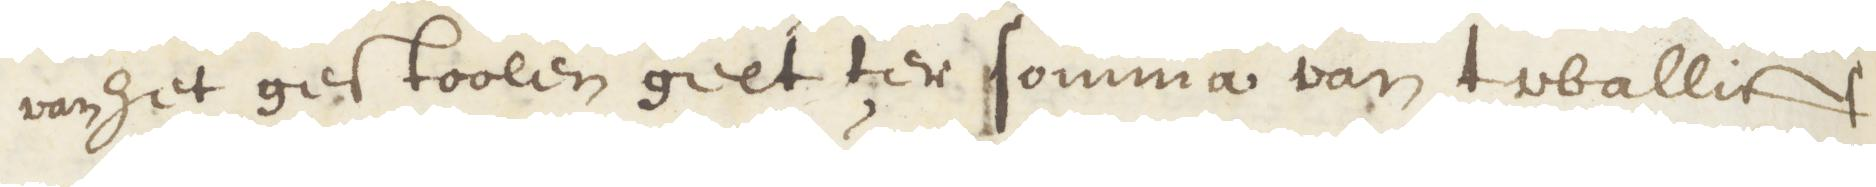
van het gestoolen gelt ter somma van twalliff
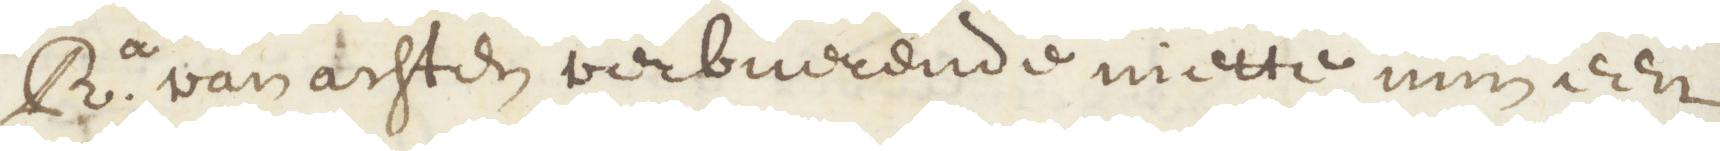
R.a van achten verbuerende niette min een
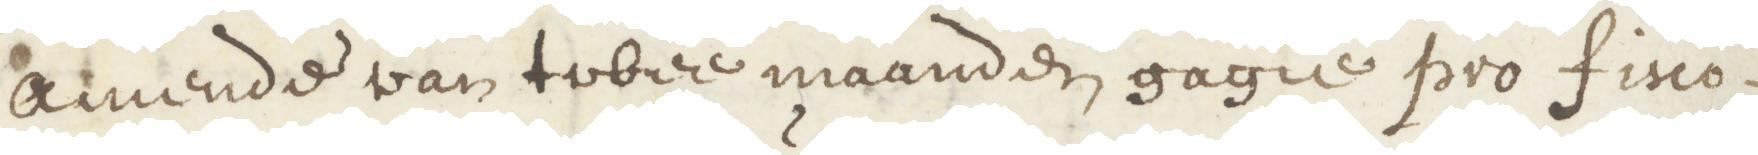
amende van twee maanden gagie pro fisco -
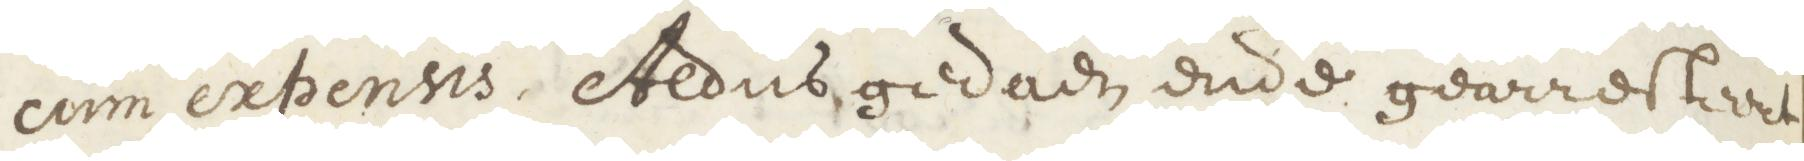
cum expensis. Aldus gedaen ende gearresteert
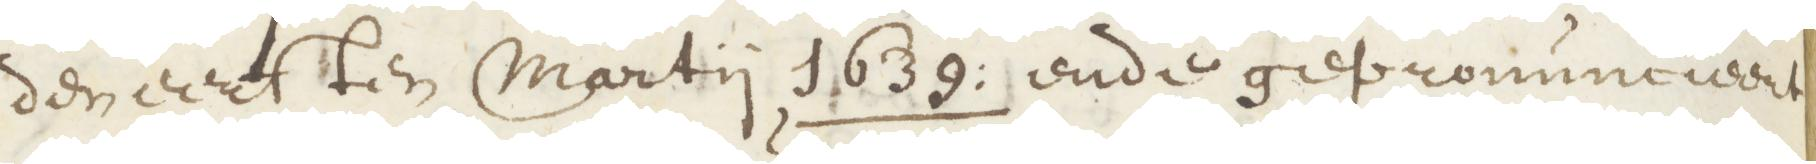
den eersten Martij 1639: ende gepronuncieert
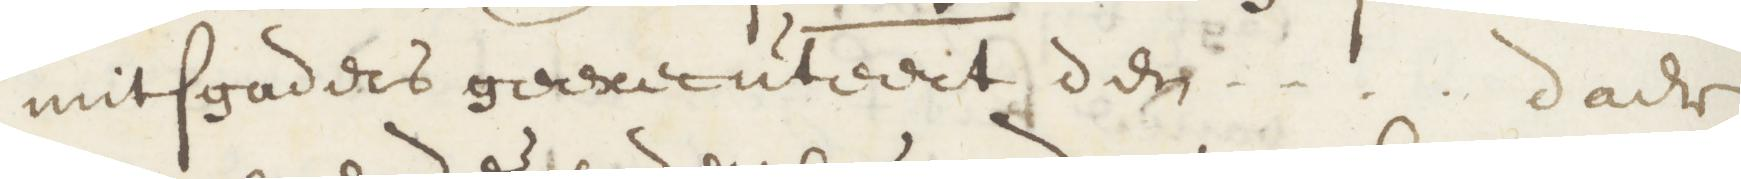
mitsgaders geexecuteert den - - - - daer
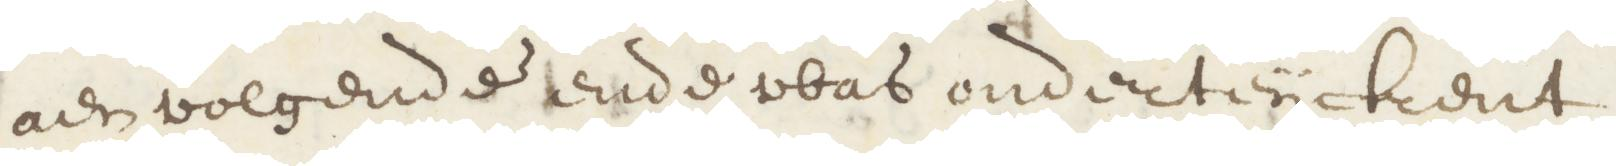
aen volgende ende was onderteijckent
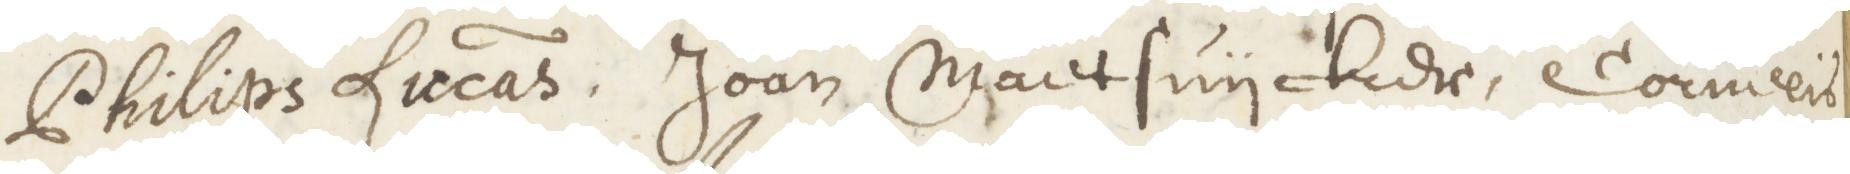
Philips Lucas. Joan Maetsuijcker, Cornelis
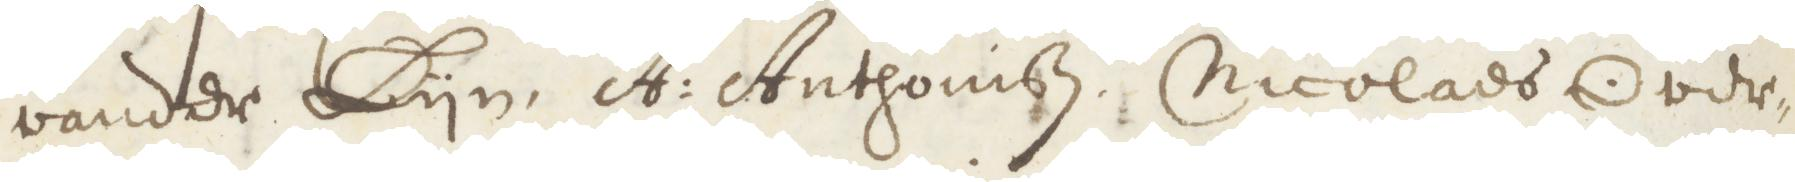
vander Lijn, A: Anthonisz. Nicolaes Over„
